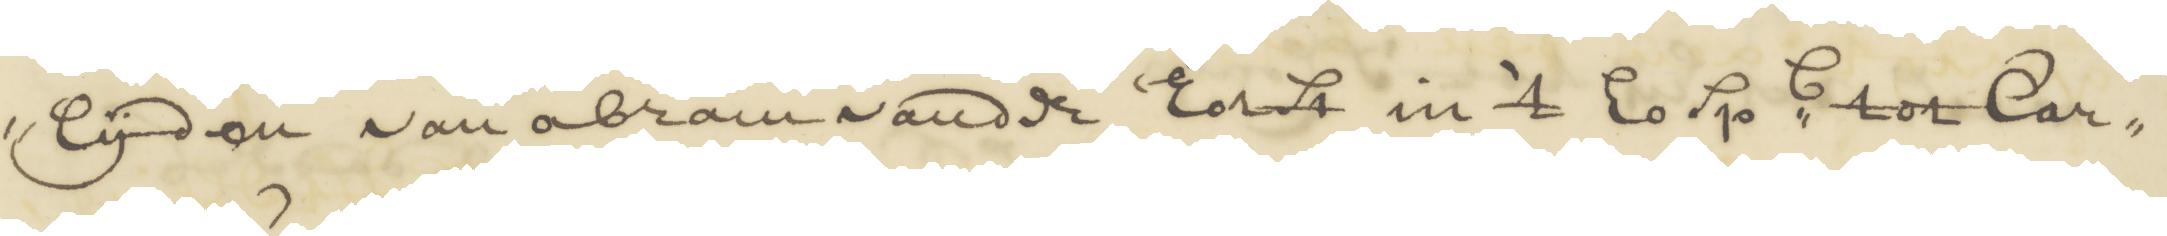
lijden van abram vander horst in ’t hosp„l tot Car„
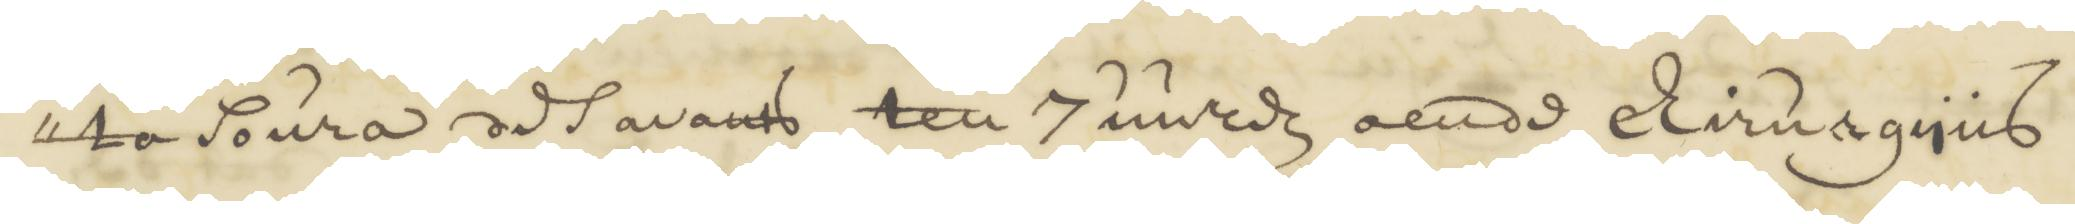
„ta soura des avonts ten 7 uuren aende chirurgijns
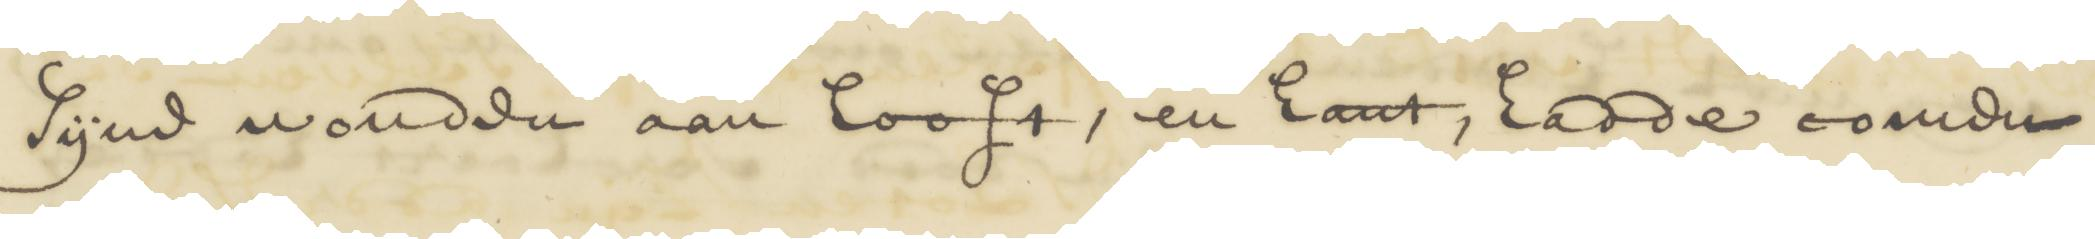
sijne wonden aan hooft, en hant, hadde comen
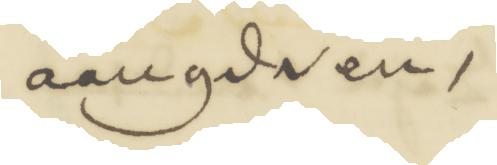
aangeven,
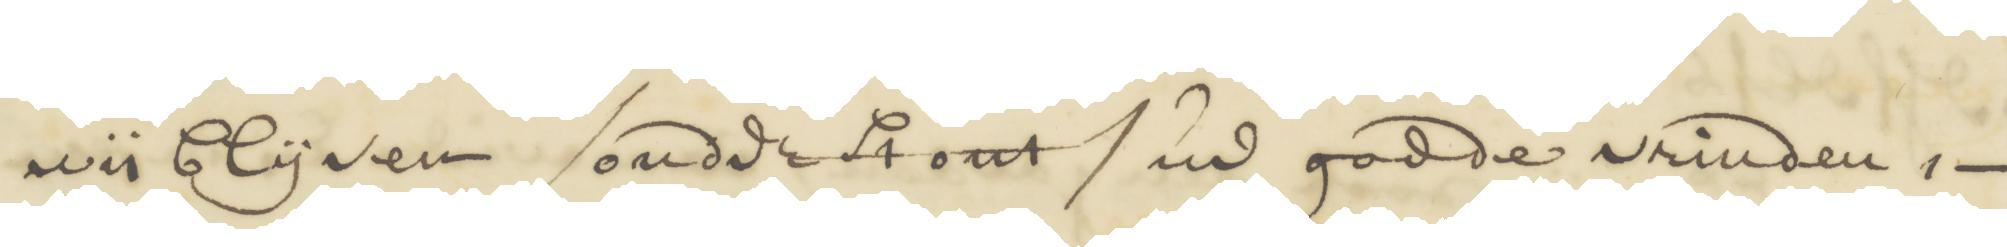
wij blijven / onderstont / u e goede vrinden, —
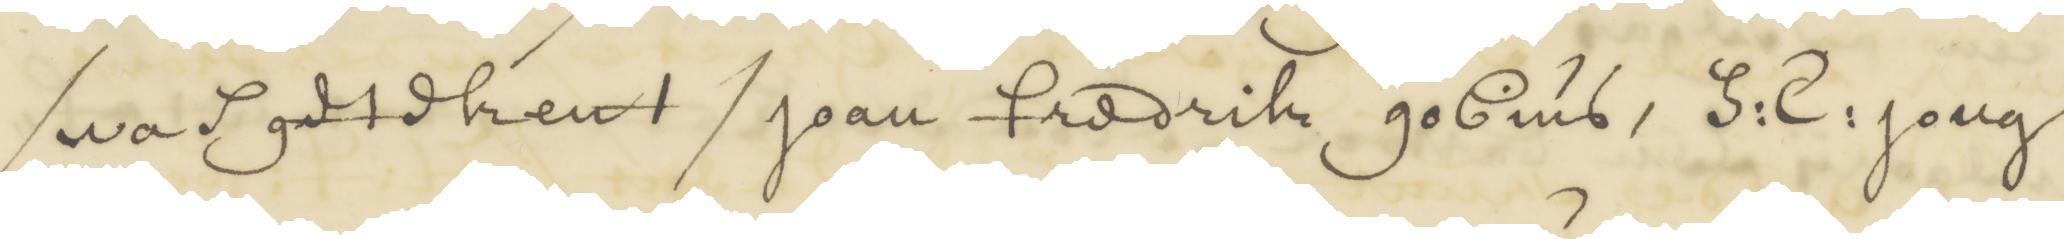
/ was getekent / joan fredrik gobius, S: C: jong
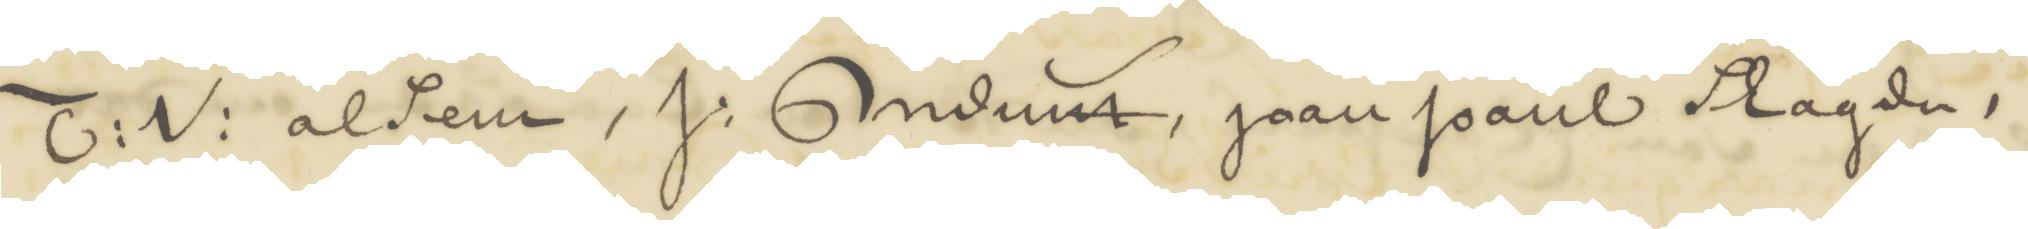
T: V: alsem, j: Mennt, joan paul slagen,
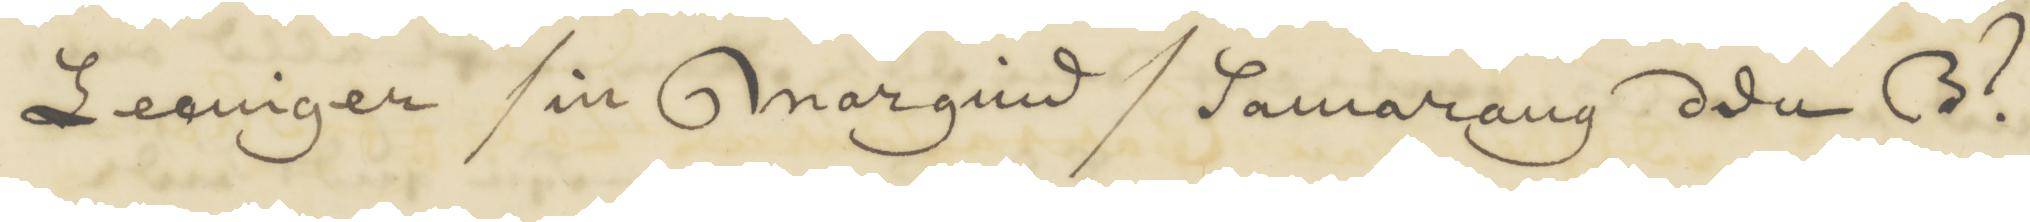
Leeniger / in margine / samarang den 3.'
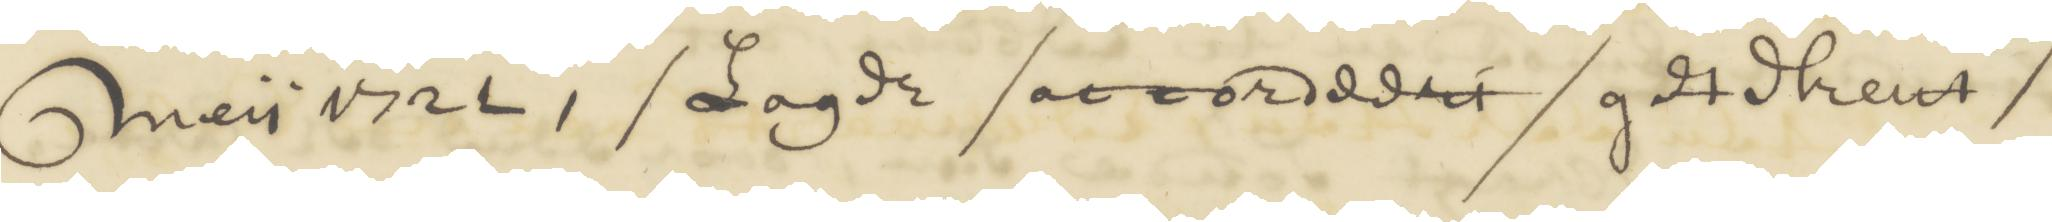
Meij 1721, / Lager / accordeert / getekent /
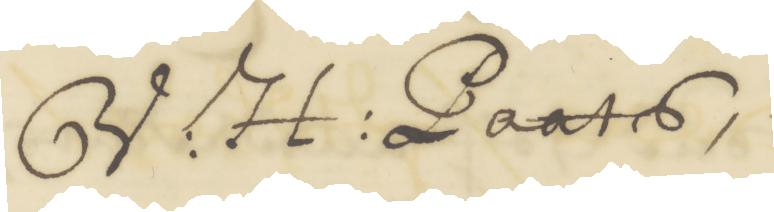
V: H: Paats,
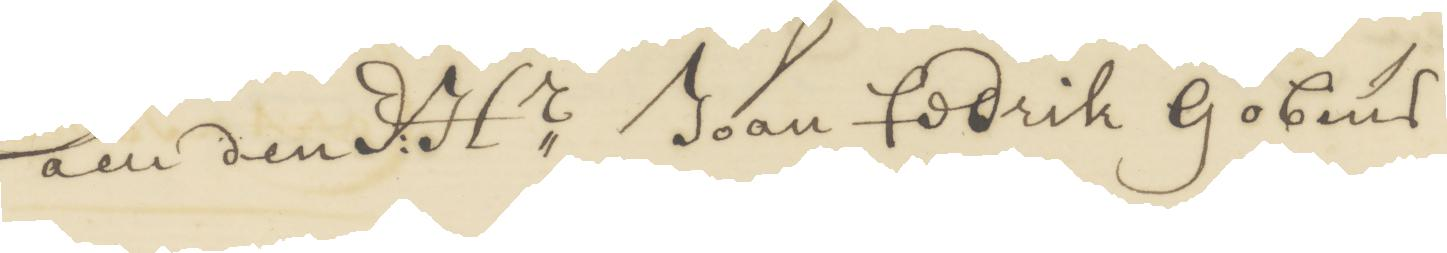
aen den V: H„r Ioan fedrik Gobius
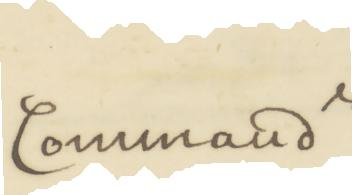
Commandr
